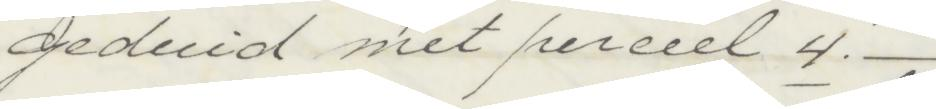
geduid met perceel 4. —
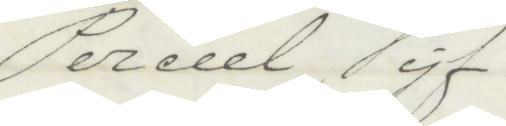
Perceel Vijf
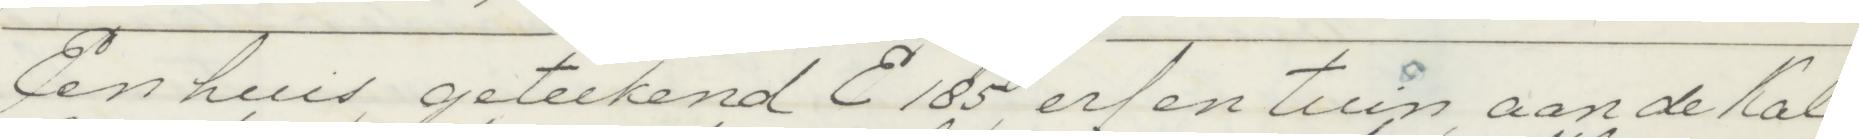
Een huis, geteekend E 185, erf en tuin, aan de Kal-
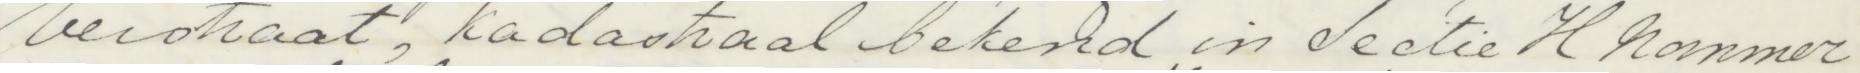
verstraat, kadastaal bekend in sectie H nommer
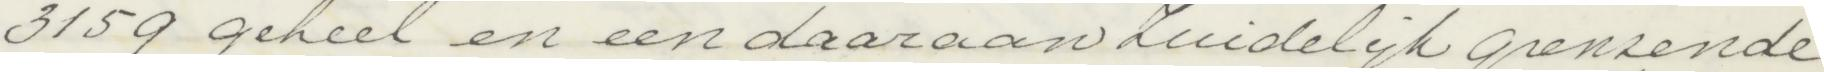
3159 geheel en een daaraan Zuidelijk grenzende
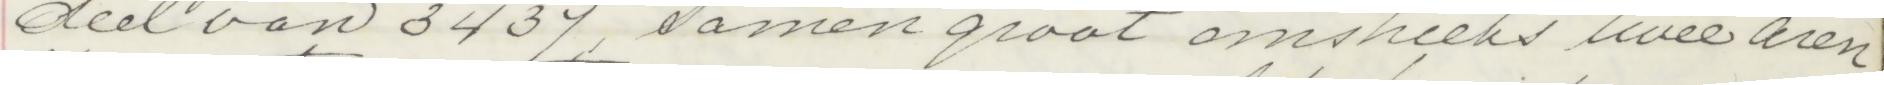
deel van 3437, samen groot omstreeks twee Aren
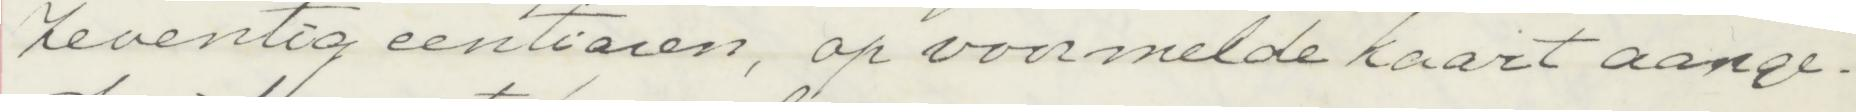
zeventig centiaren, op voormelde kaart aange
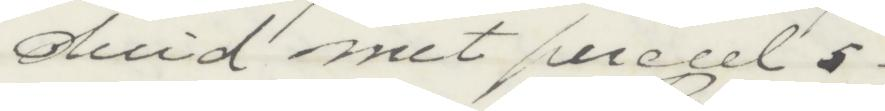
duid met perceel 5
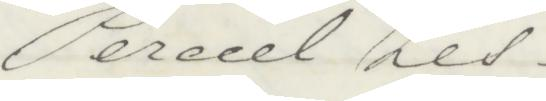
Perceel Zes
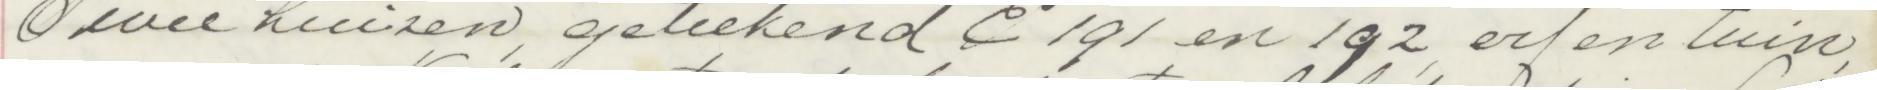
Twee huizen geteekend E 191 en 192, erf en tuin,
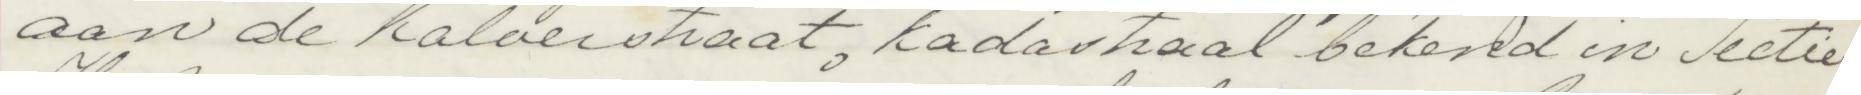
aan de Kalverstraat, kadastraal bekend in sectie
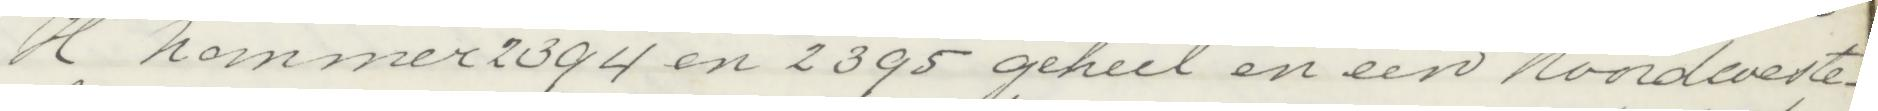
H nommer 2394 en 2395 geheel en een Noordweste-
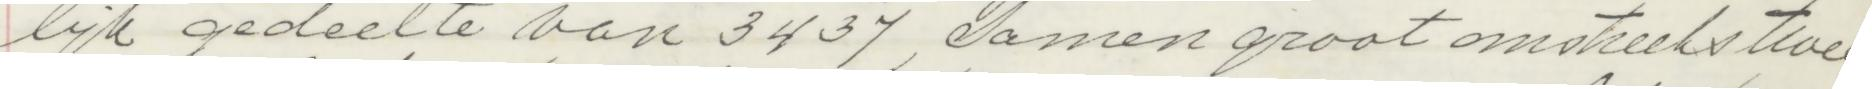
lijk gedeelte van 3437, samen groot omstreeks twee
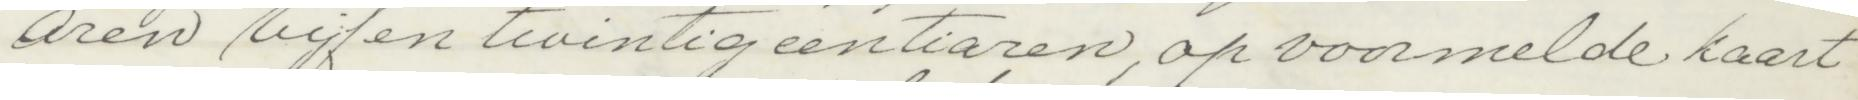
Aren vijf en twintig centiaren, op voormelde kaart
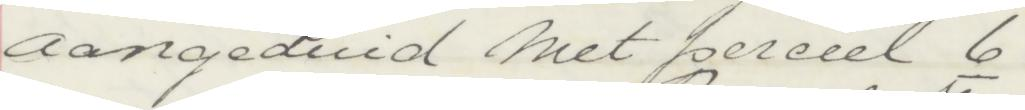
aangeduid met perceel 6
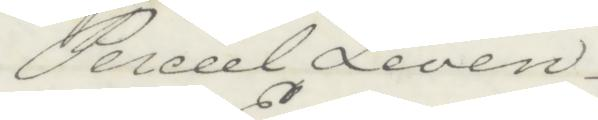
Perceel Zeven
